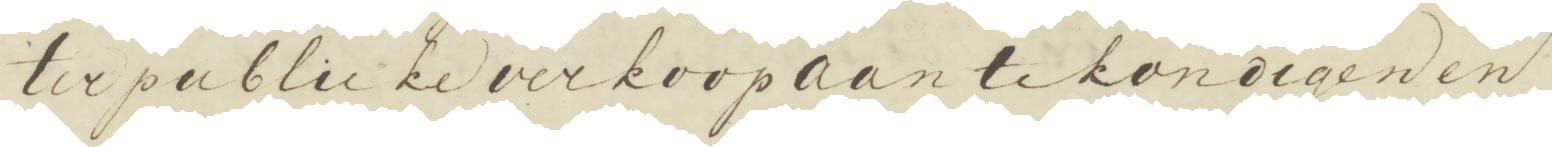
ter publieke verkoop aan te kondigen en
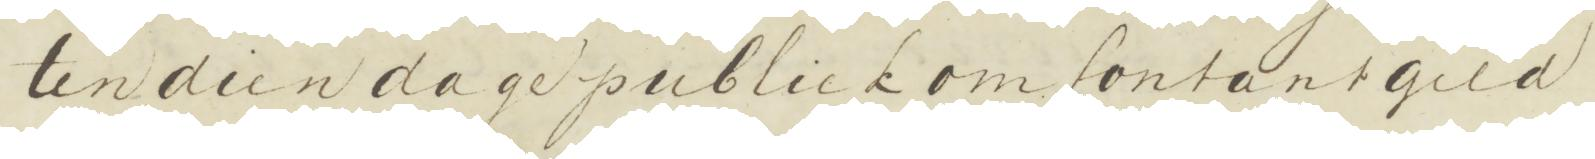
ten dien dage publiek om contant geld
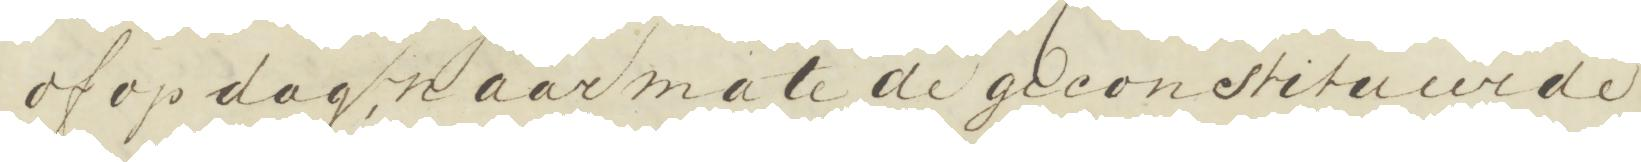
of op dag, naar mate de geconstituurde
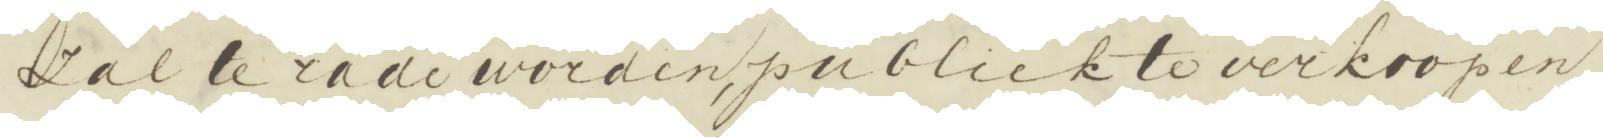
zal te rade worden, publiek te verkoopen
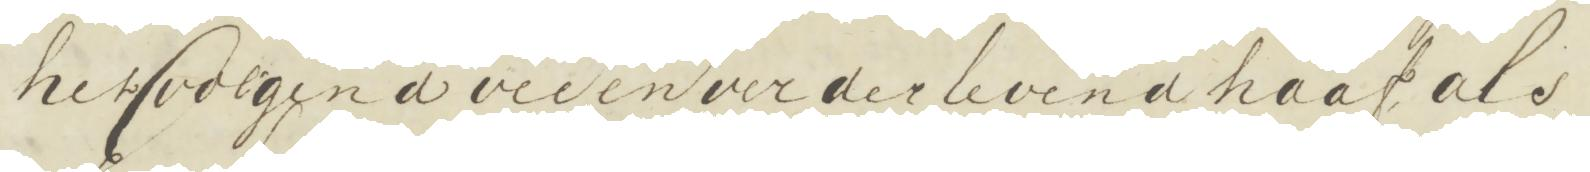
het volgend vee en verder levend haaf, als
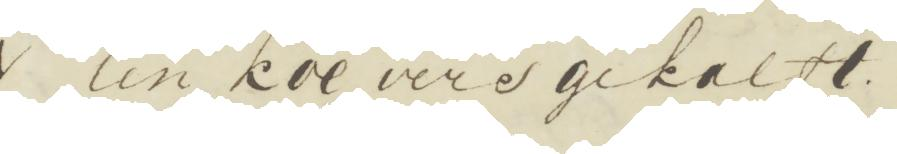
1 Een koe, vers gekalft.
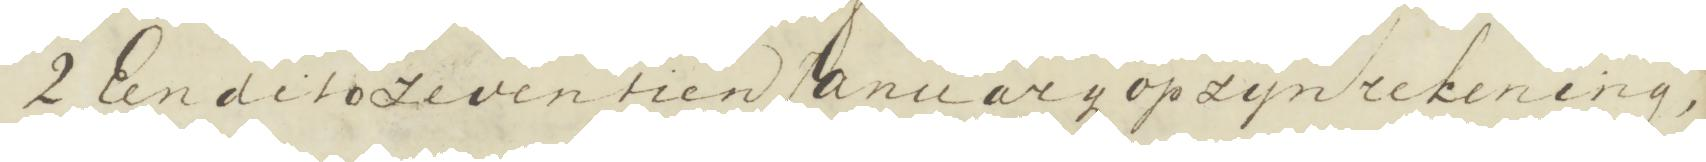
2 Een dito zeventien January op zyn rekening,
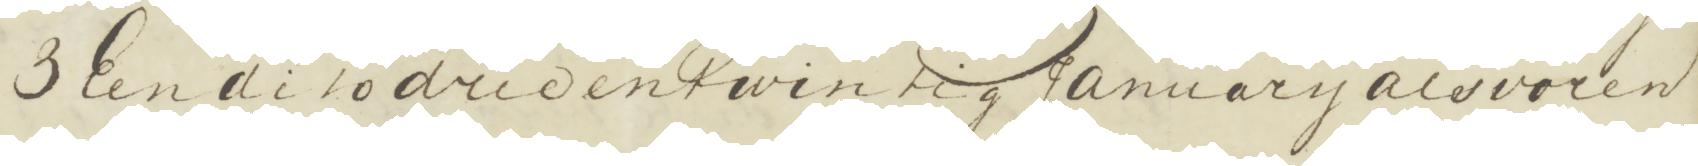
3 Een dito drie en twintig January als voren
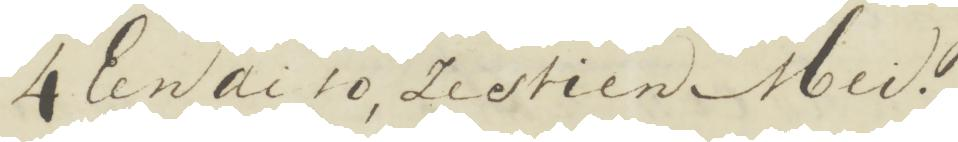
4 Een dito, zestien Mei.
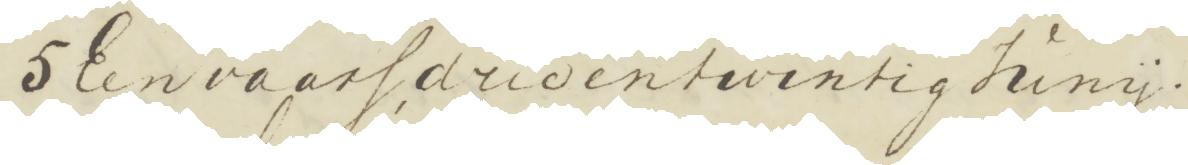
5 Een vaars, drie en twintig Junij.
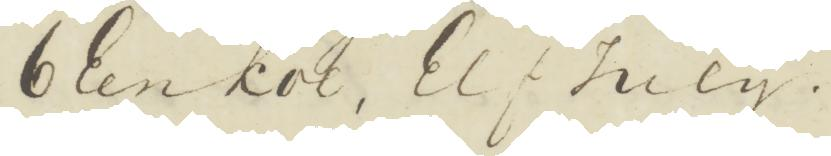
6 Een koe, Elf July.
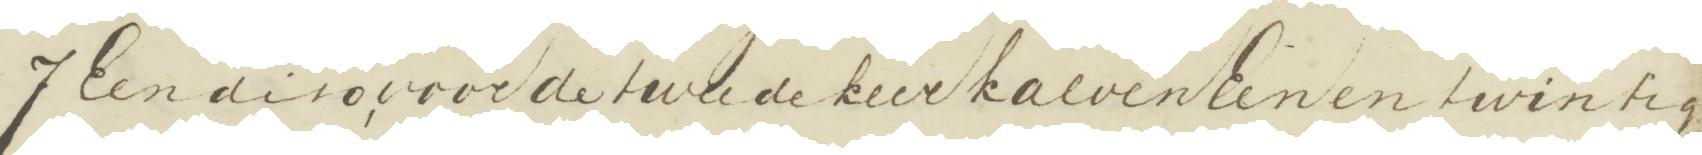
7 Een dito, voor de twee de keer kalven Een en twintig
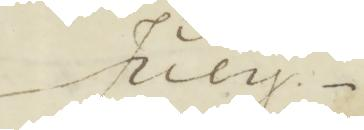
July. –
